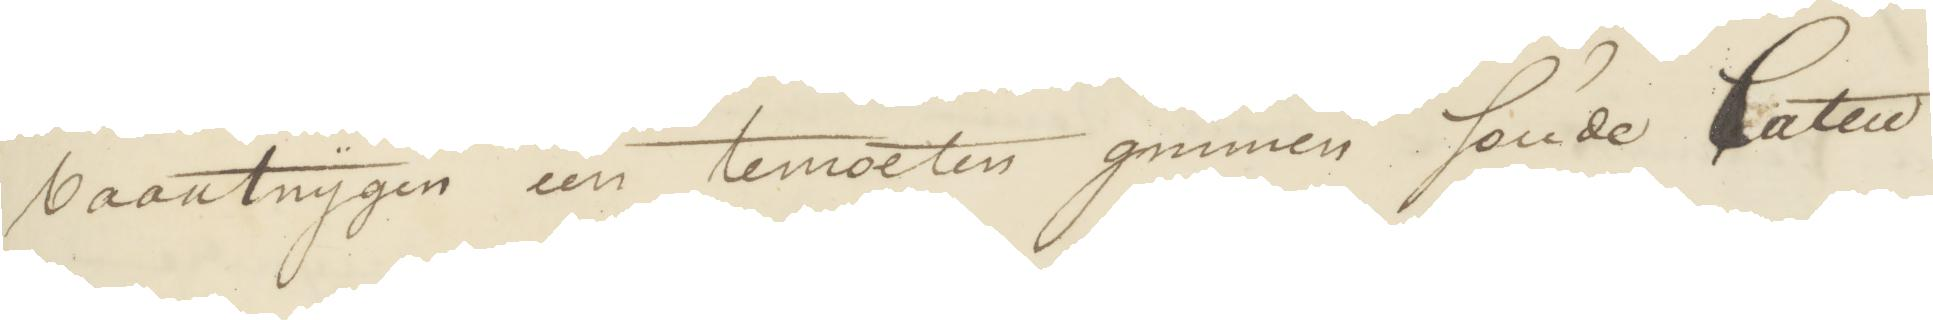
vaartuijgen een temoeten gunnen soude laten
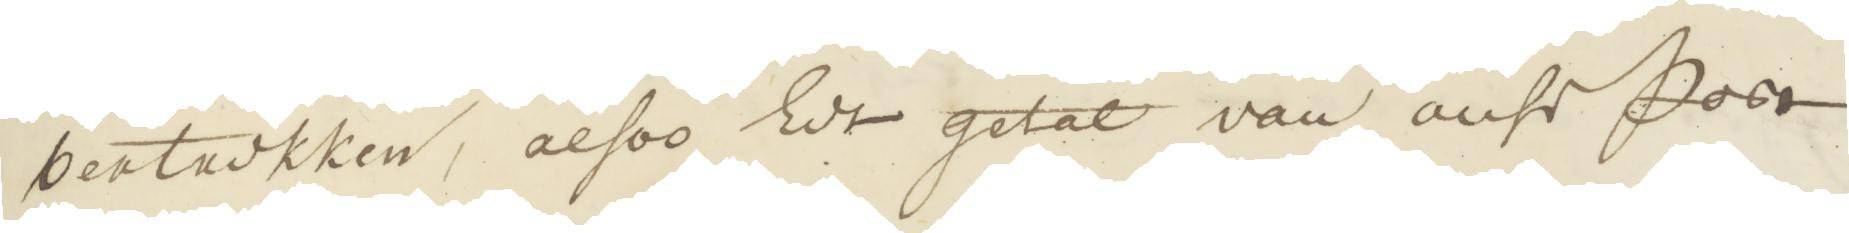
vertrekken, alsoo het getal van onse Post
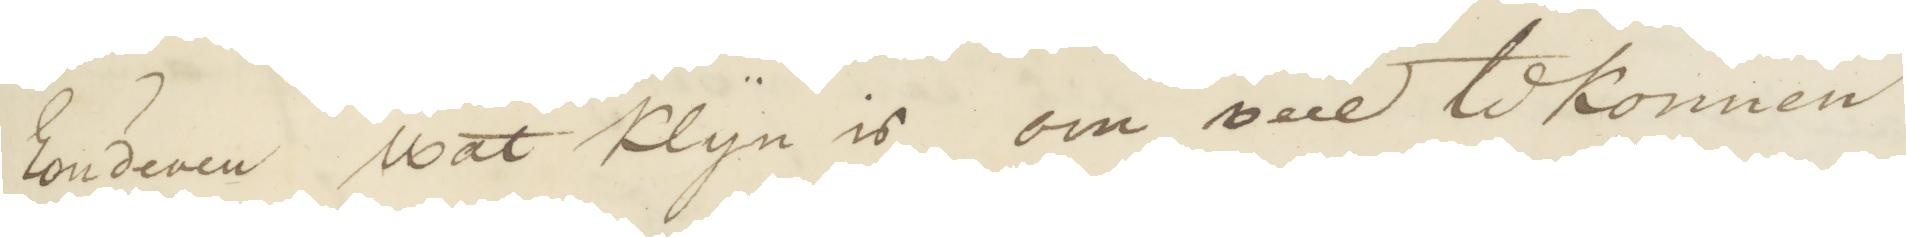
houderen wat klijn is om veel tekonnen
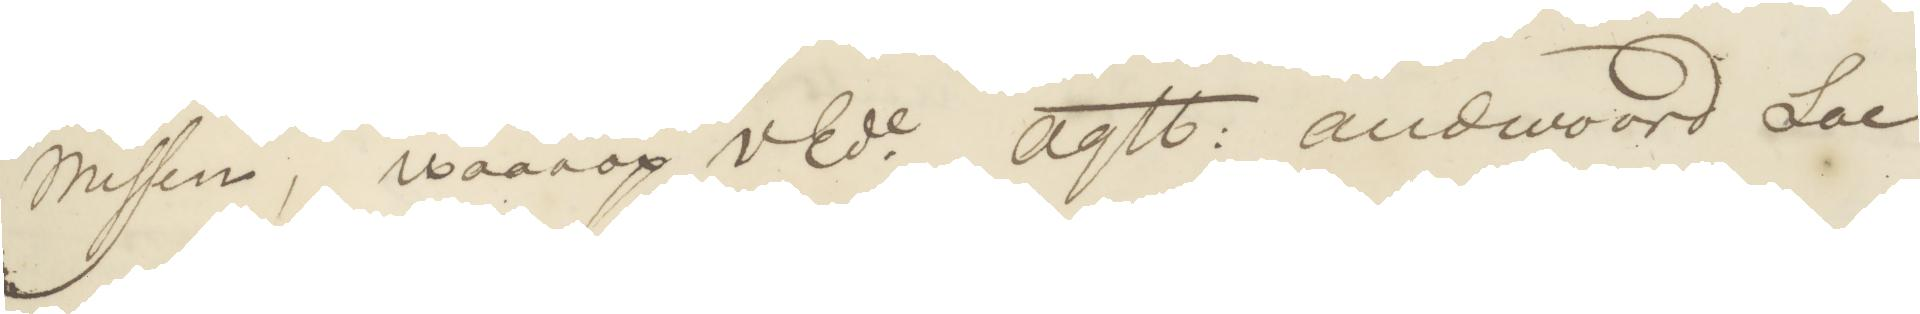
missen, waarop vEd:e agtb: andwoord sal
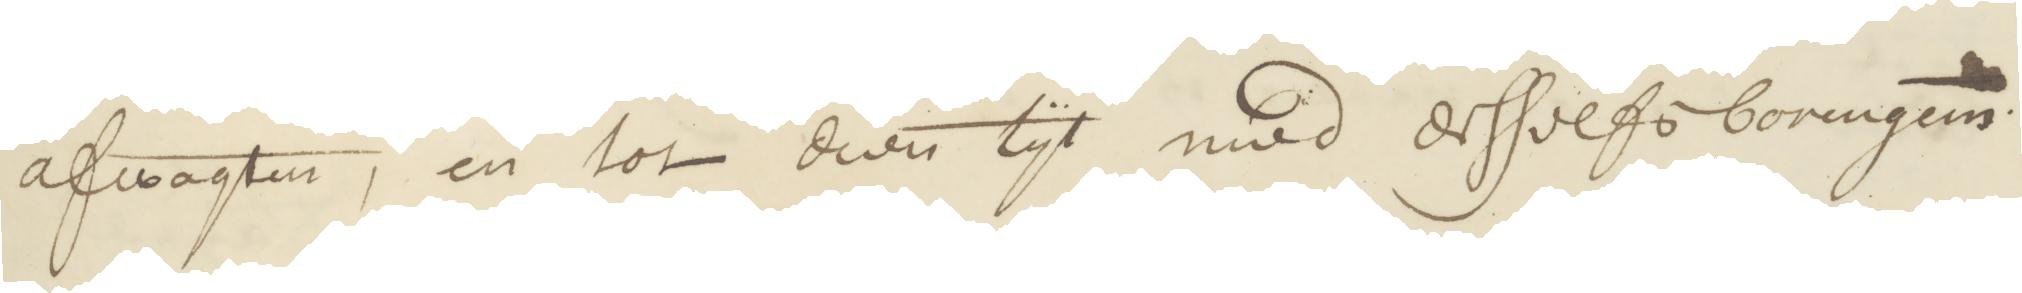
afwagten, en tot dien tijt med desselfs bovengem:
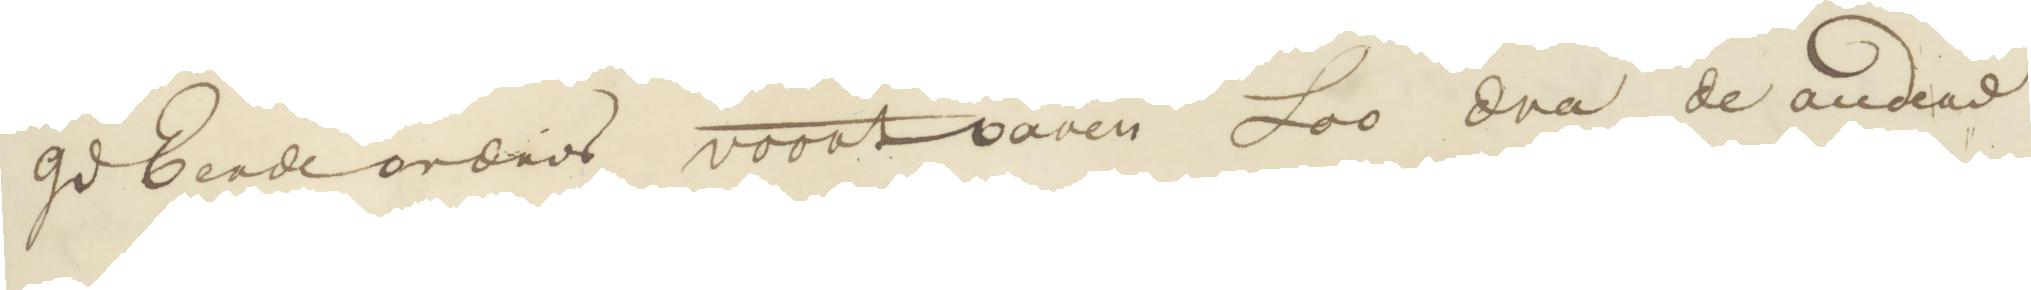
geEerde ordres voortvaren soo dra de andere
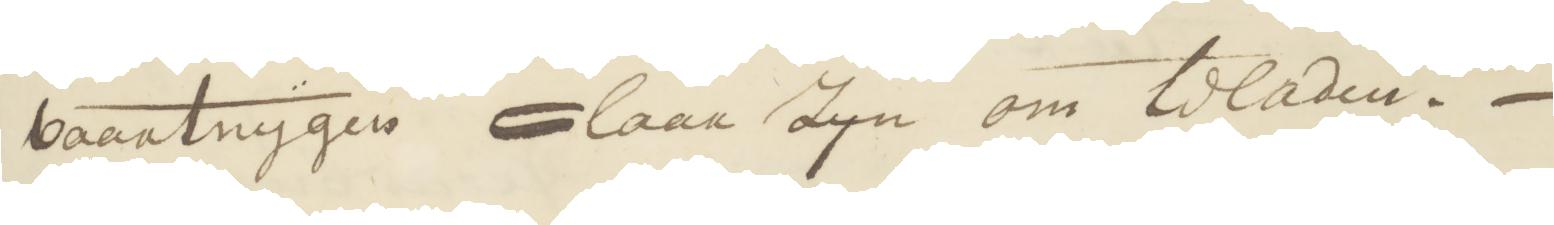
vaartuijgen claar zijn om teladen. —
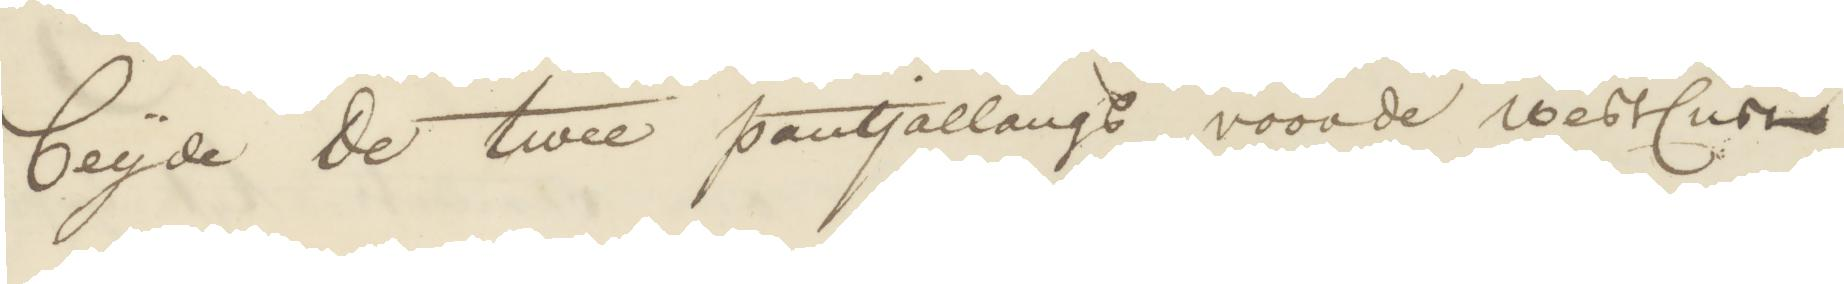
beijde de twee pantjallangs voorde westcust
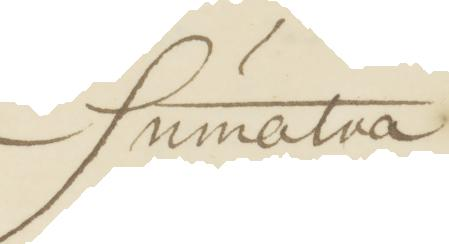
Sumatra
